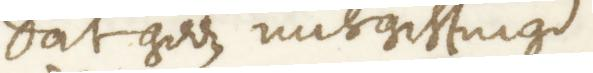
dat geen misgissinge
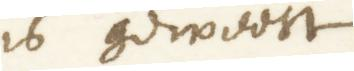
is geweest
